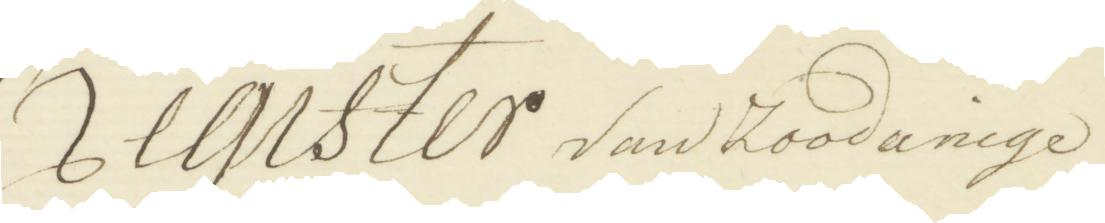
Register van zoodanige
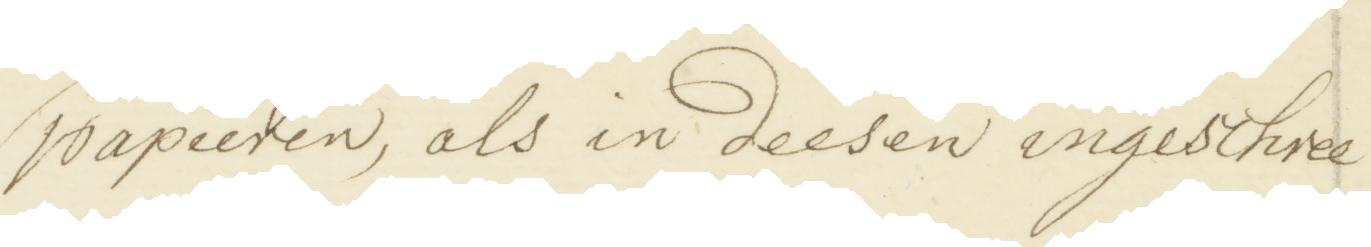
papieren, als in deesen ingeschree
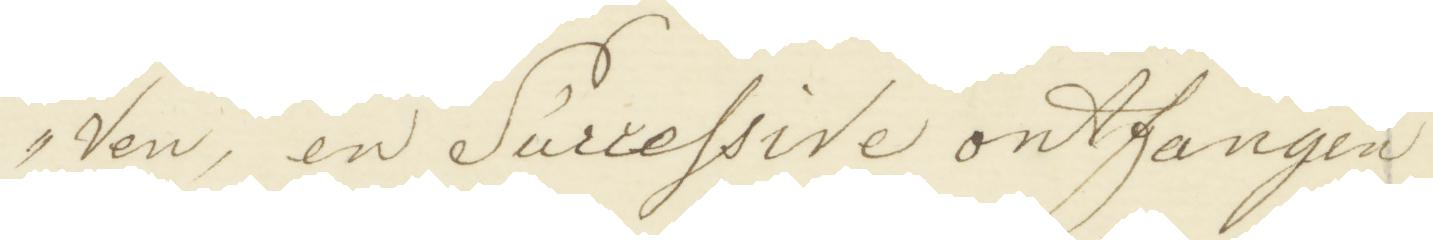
„ven, en Successive ontfangen
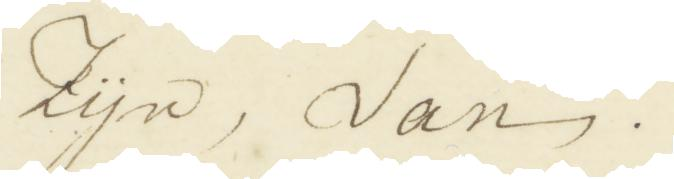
zijn, van.
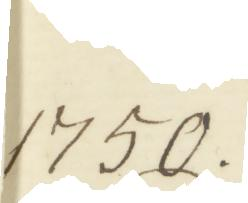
1750.
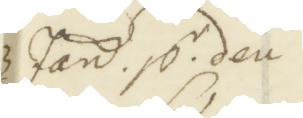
3 Jan. p.r den
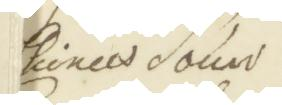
Chinees Souw
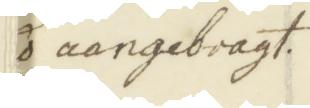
d aangebragt.
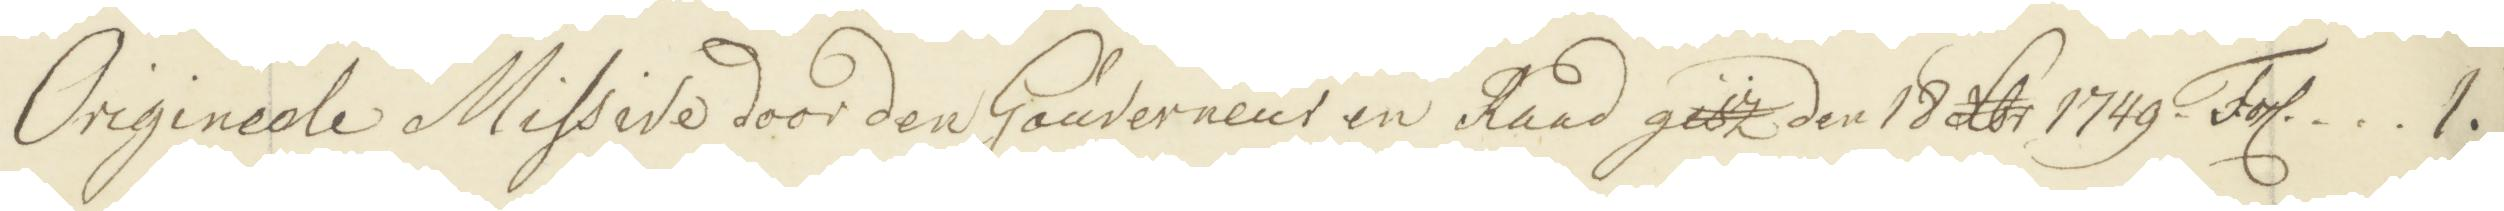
Origineele Missive door den Gouverneur en Raad gesz den 18 Xbr 1749 - Fol. 1.
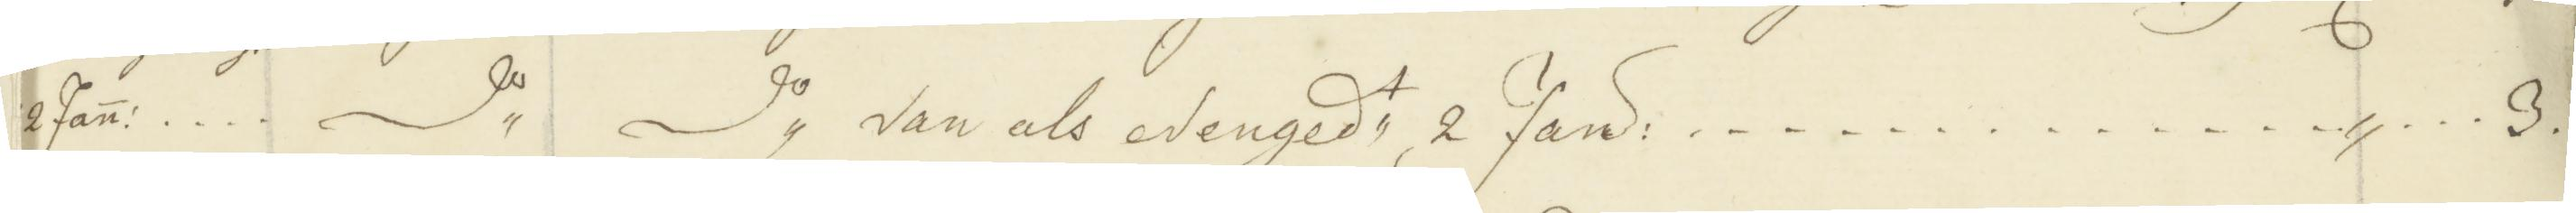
2 Jan: - - - - d„o d„o van als evenged„t 2 Jan: - - - - - - - - - - - - - - „ - - - 3.
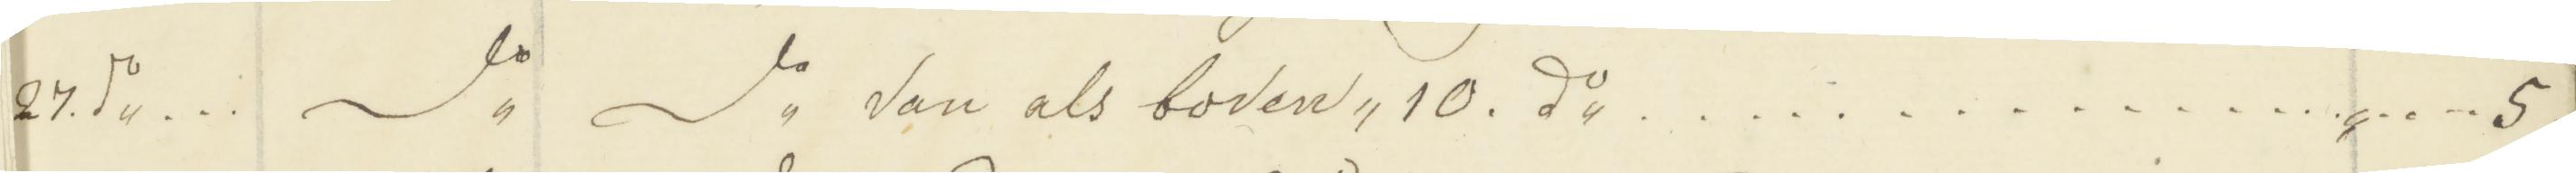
27. d„o - - - do „ d„o van als boven „ 10. d„o - - - - - - - - - - - - - - - „ - - - 5.
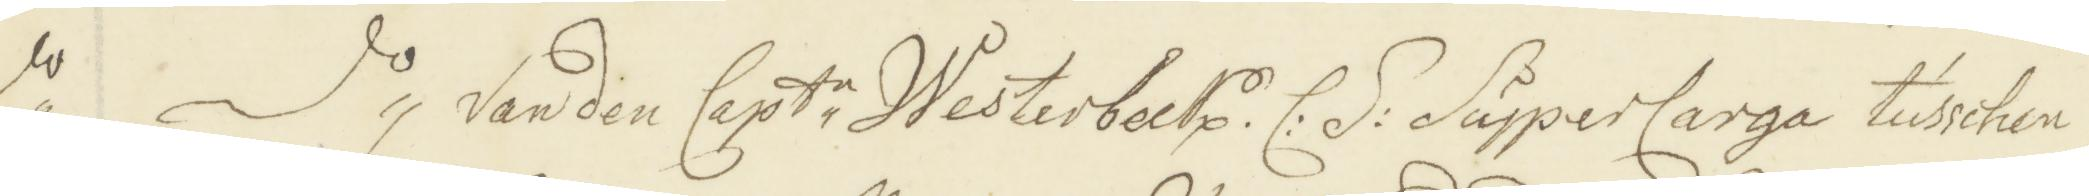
d„o d„o van den Capt„n Westerbeck. C: S: Supper Carga tusschen
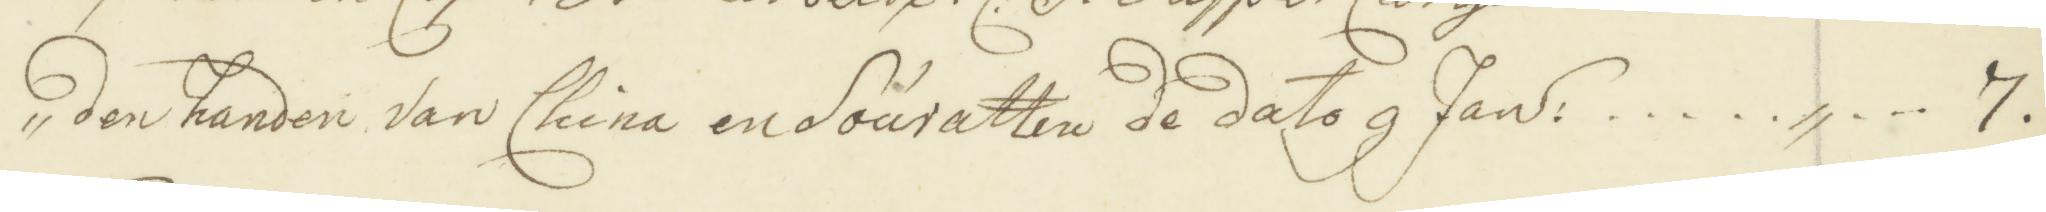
„den handen van China en Souratten de dato 9 Jan: - - - - - „ - - - 7.
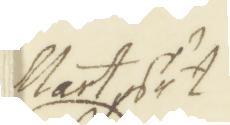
Mart p„' 't
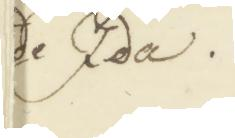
de Ida.
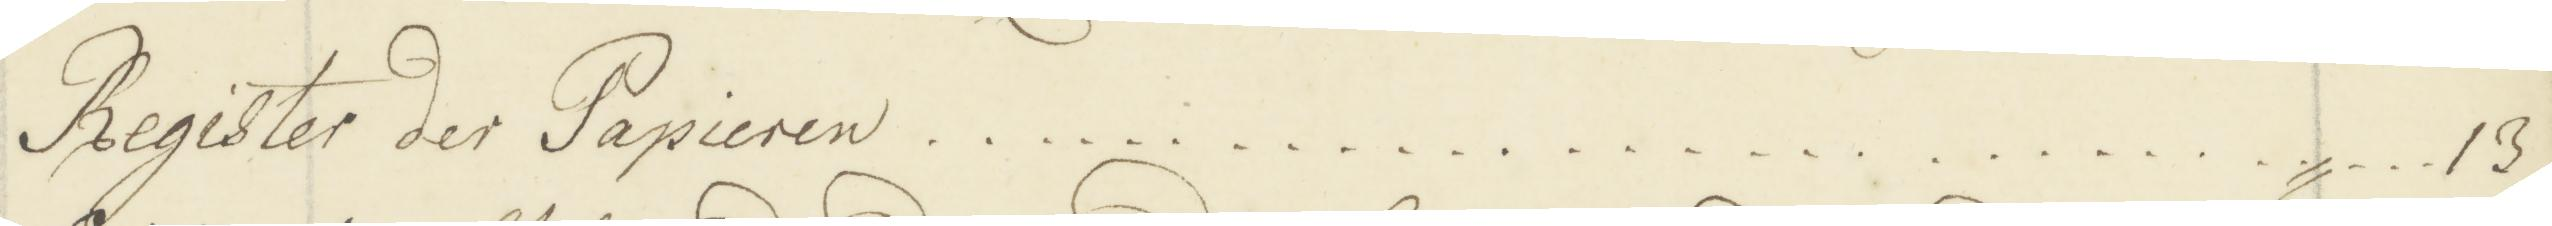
Register der Papieren - - - - - - - - - - - - - - - - - - - - - - - - - - - „ - - - 13
